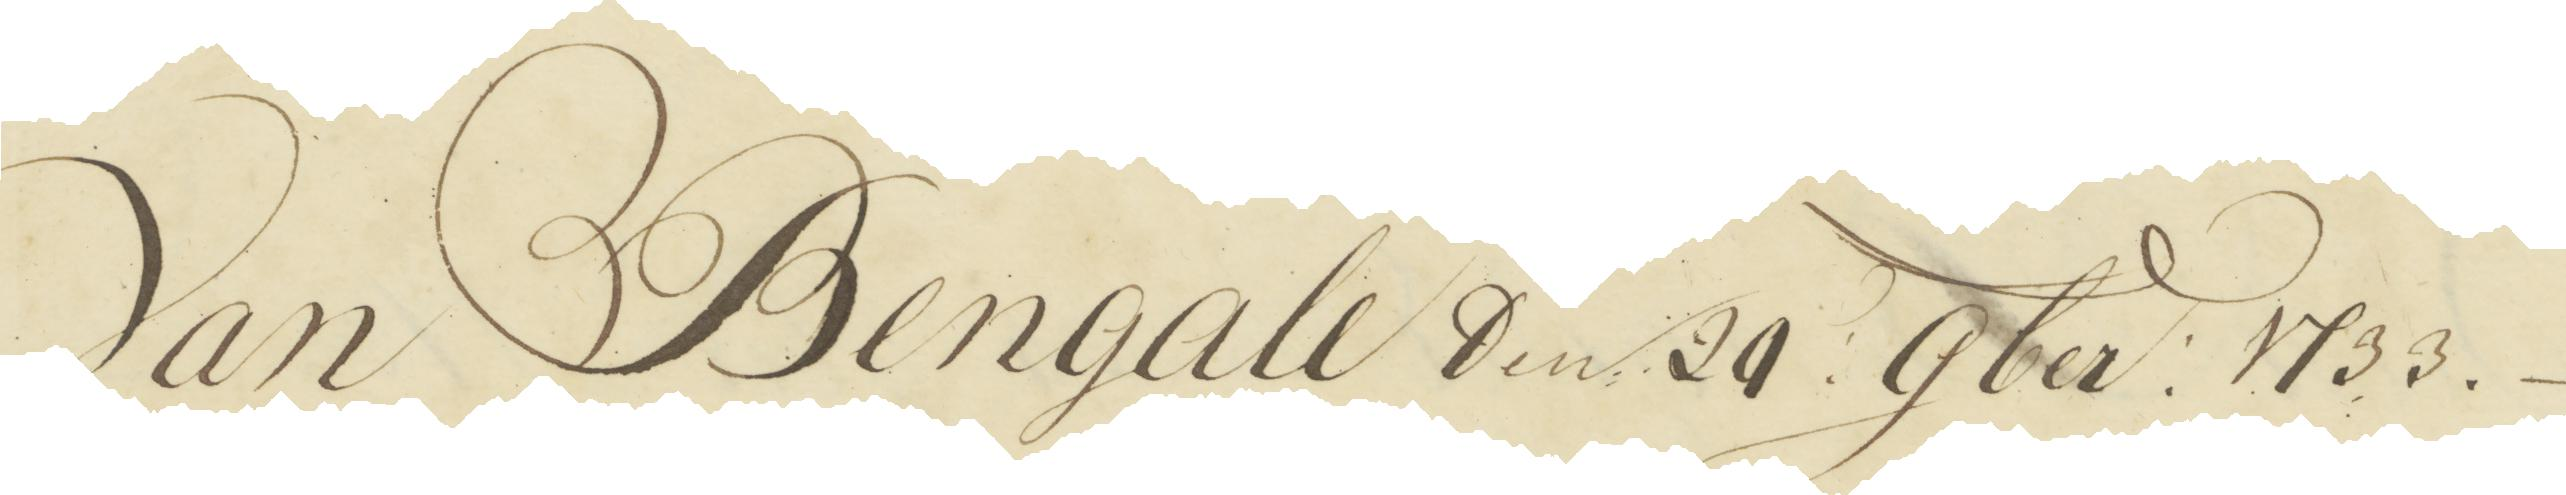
Van Bengale den 24:' 9ber: 1733.—
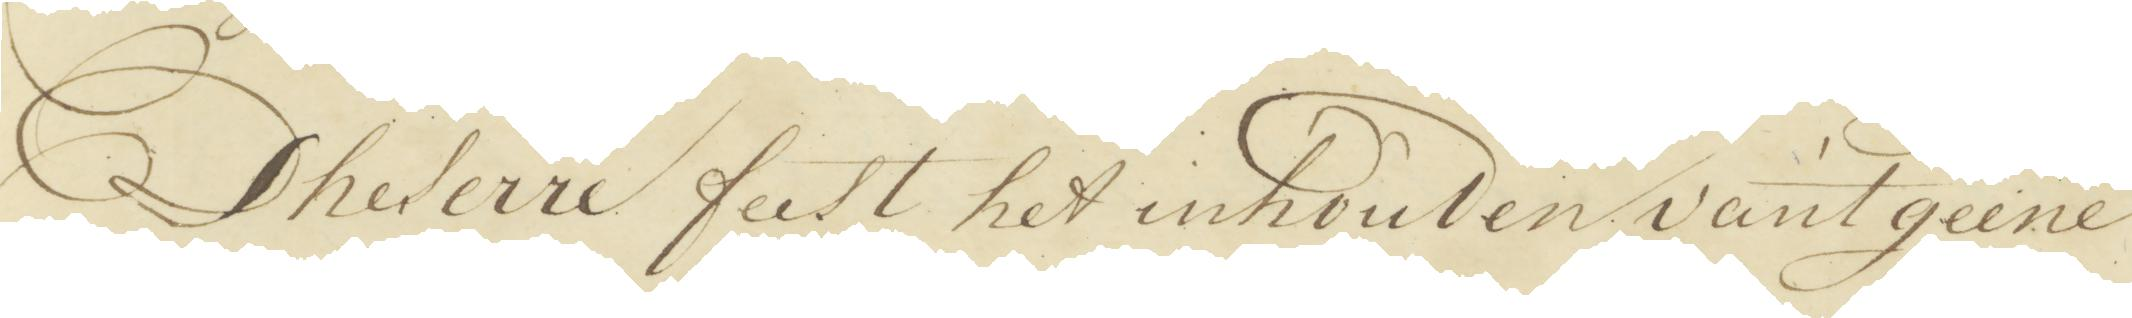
Dheserre feest het inhouden van 't geene
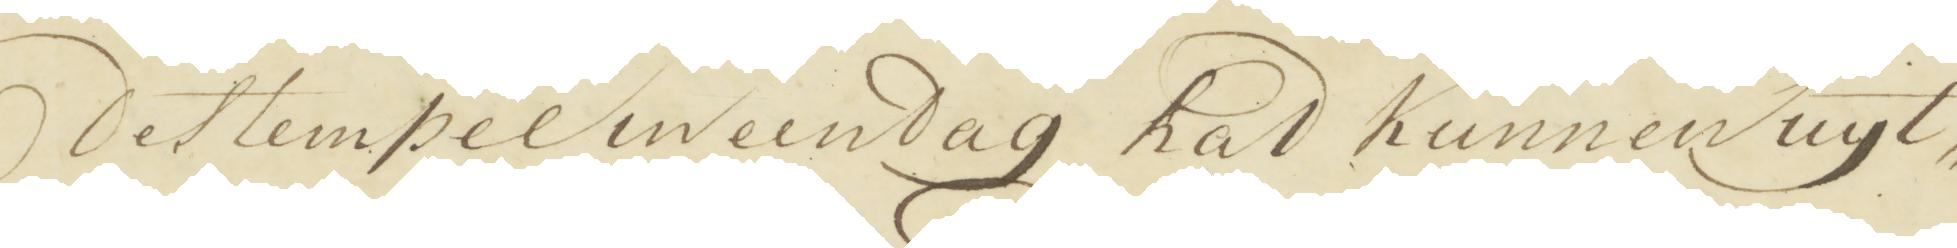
de Stempel in een dag had Kunnen uijt„
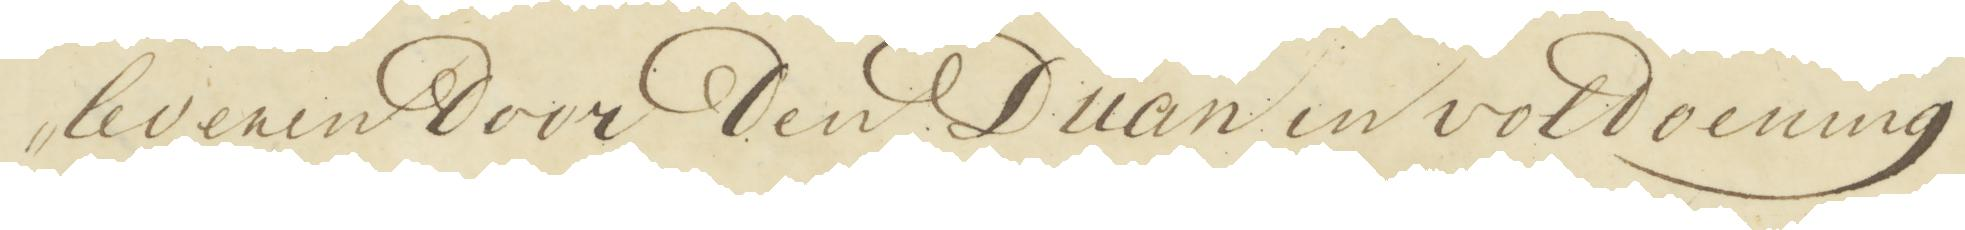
„leveren door den Duan in voldoening
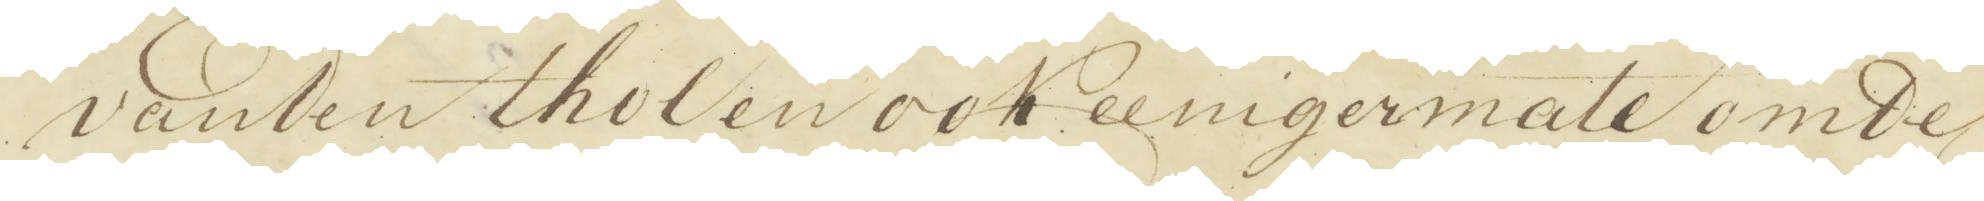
van den tholen ook eenigermate om de
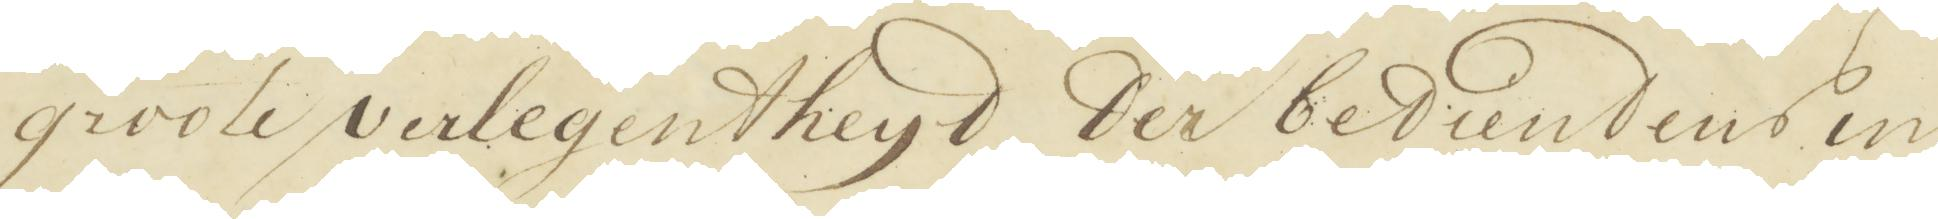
groote verlegentheyd der bediendens in
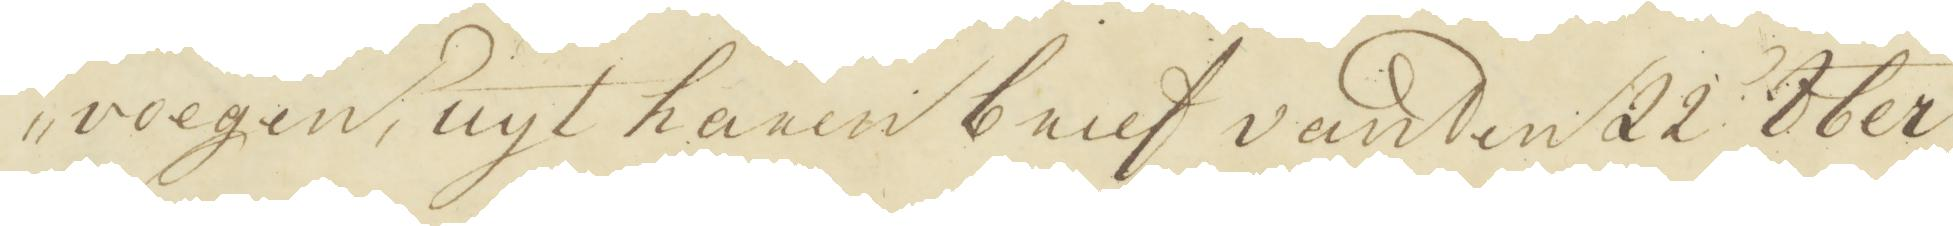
„voegen, uijt haren brief van den 22:' 8ber:
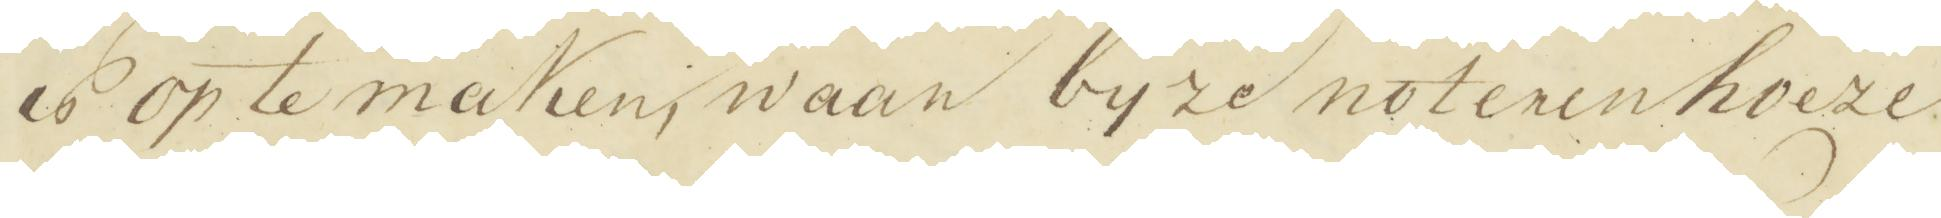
is op te maken, waar bij ze noteren hoe ze
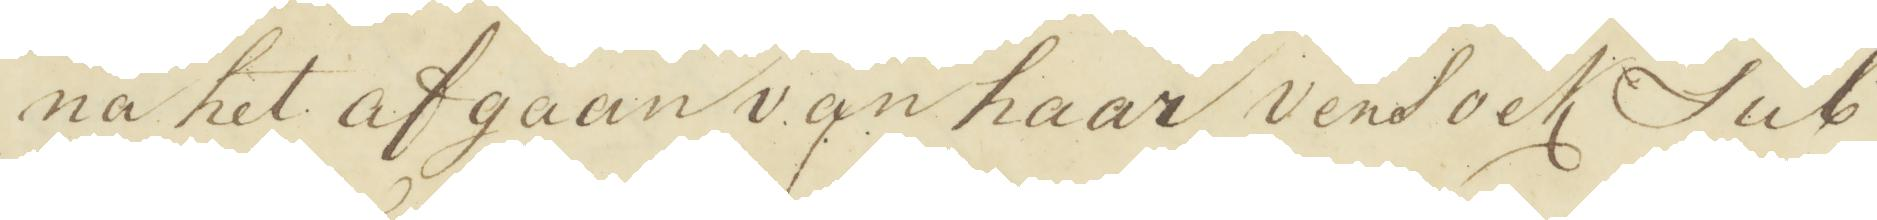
na het afgaan van haar versoek sub
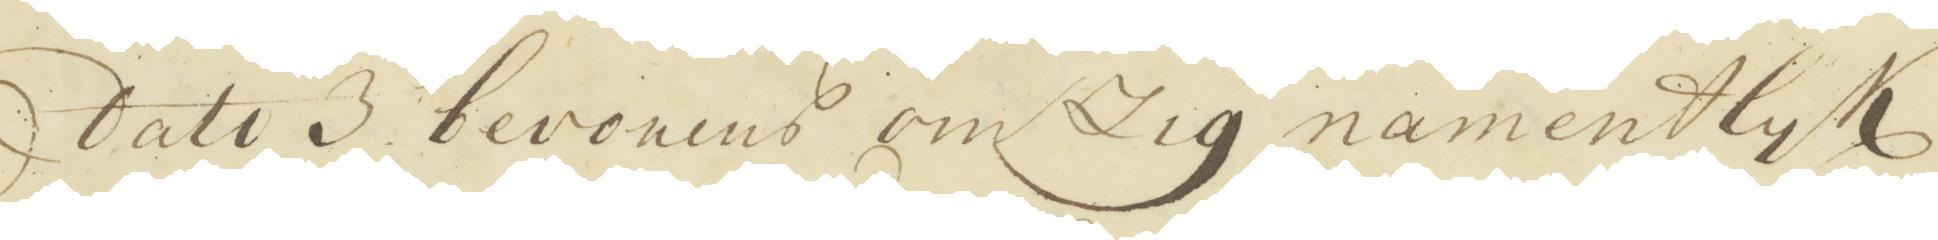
dato 3: bevorens om Zig namentlyk
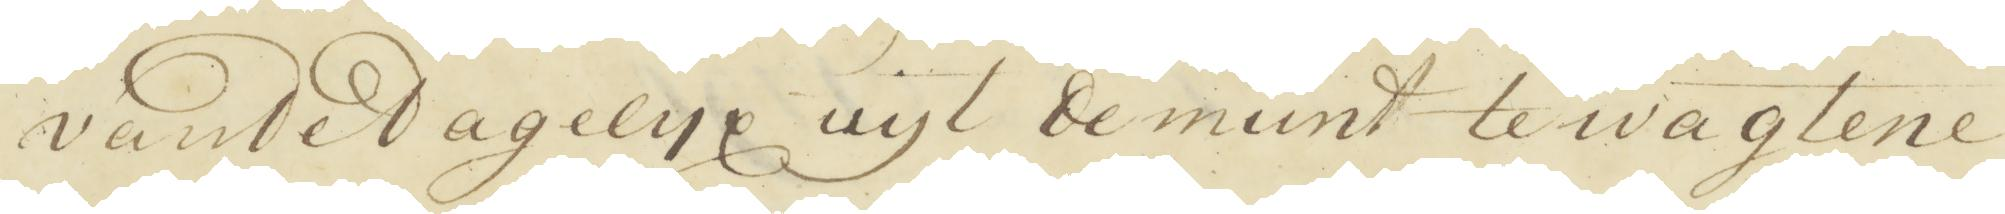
van de dagelijx uijt de munt te wagtene
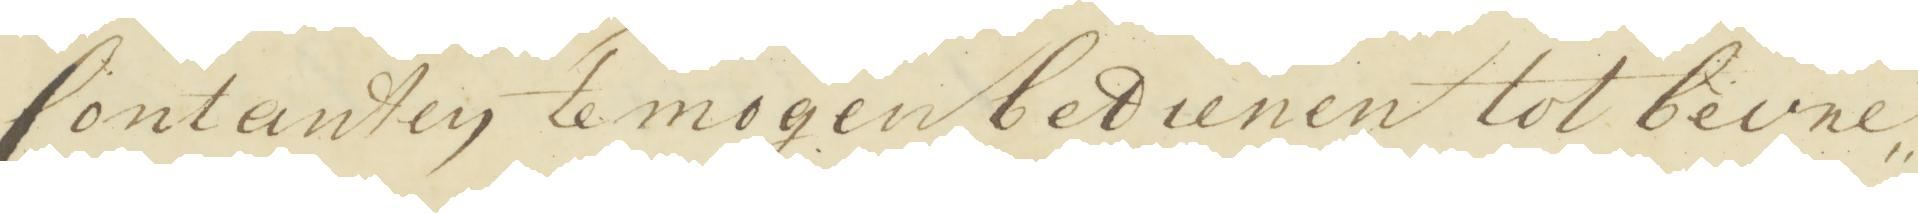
Contanten te mogen bedienen tot bevre„
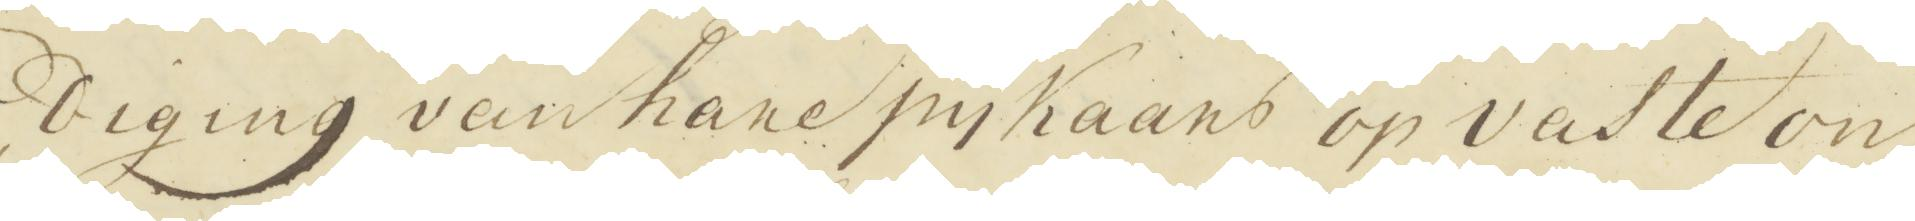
„diging van hare pijkaars op vaste on
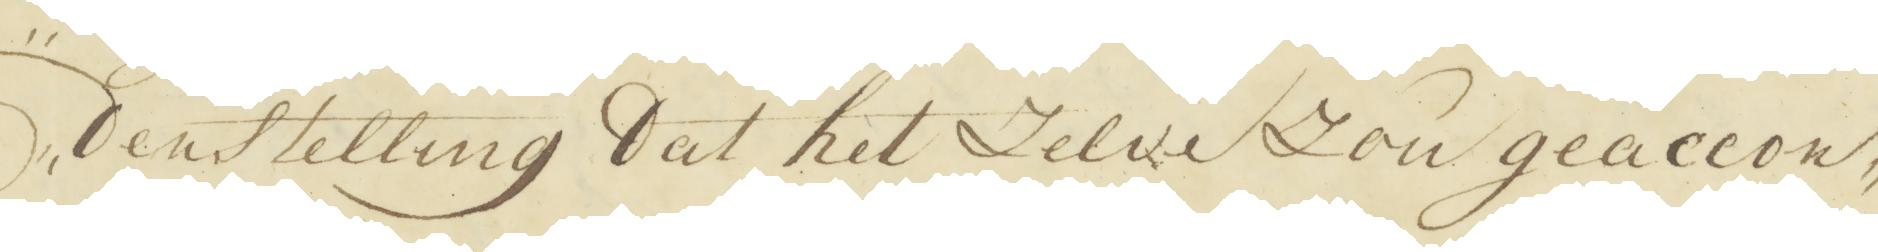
„derstelling dat het zelve zou geaccor„
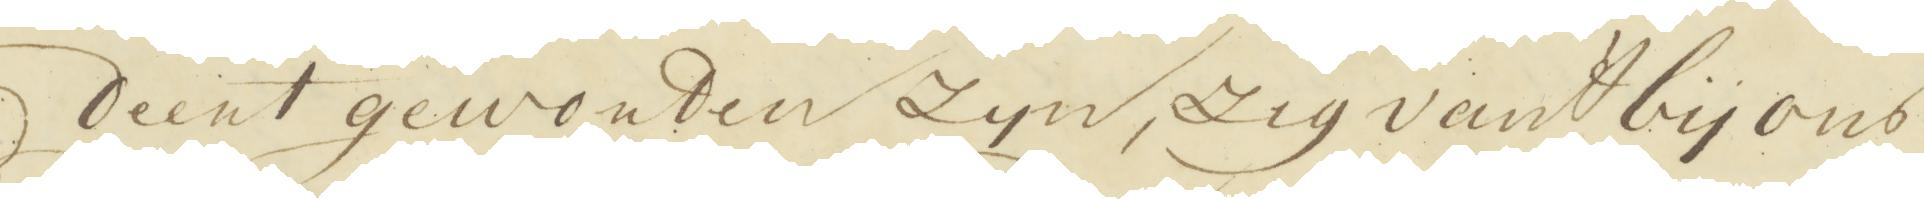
deert geworden zijn, zig van 't bij ons
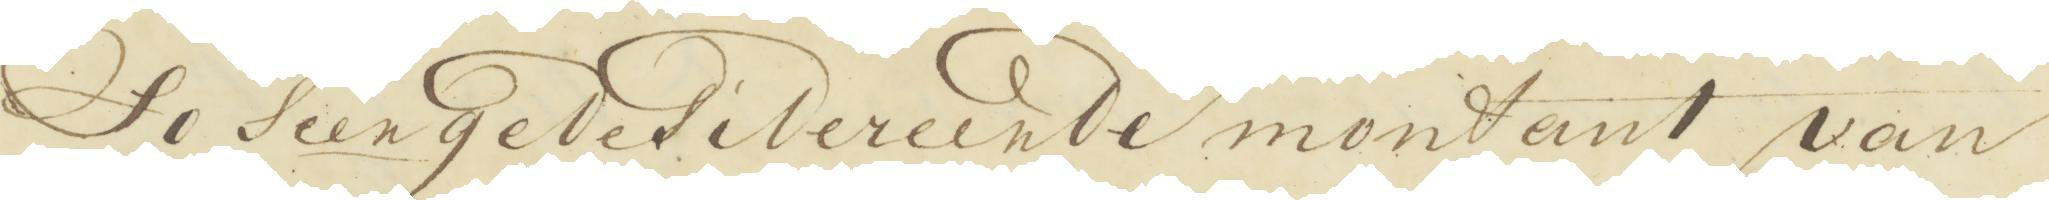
So Seer gedesidereerde montant van
